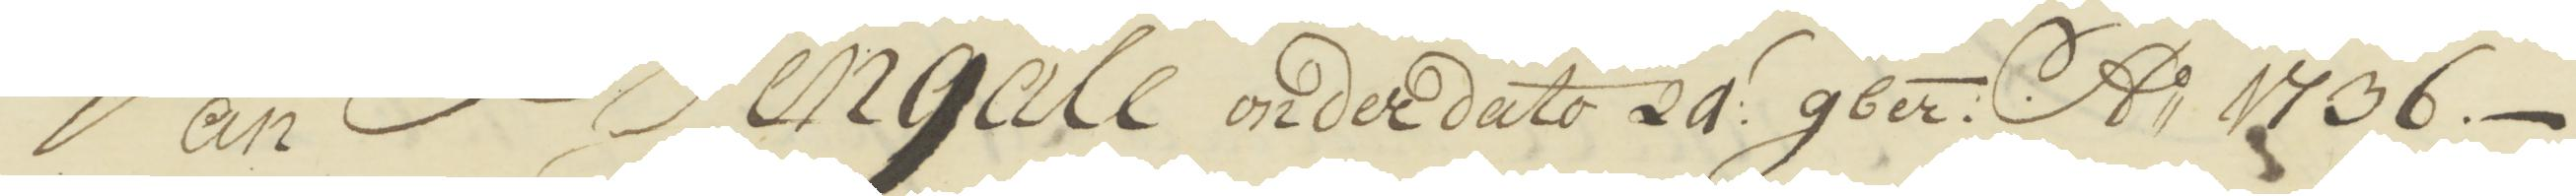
Van Bengale onder dato 24:' 9ber: A„o 1736.—
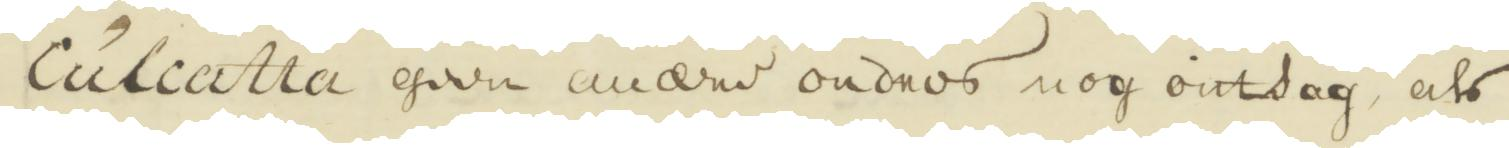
Culcatta geen andere ordres nog ontsag, als
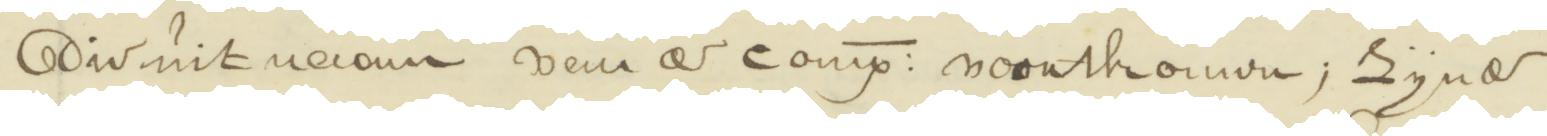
die uit naam van de comp: voortkomen; zijnde
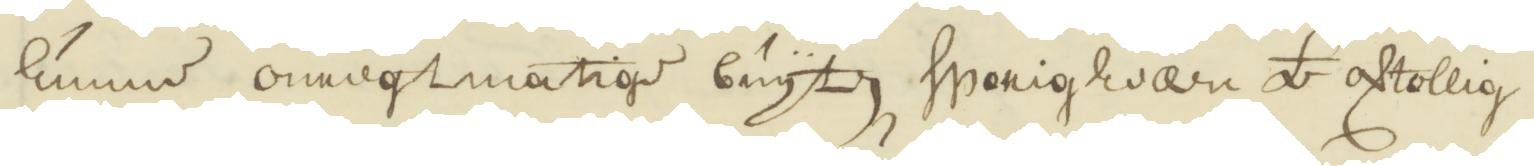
hunne onregtmatige buijten sporigheden te overtollig
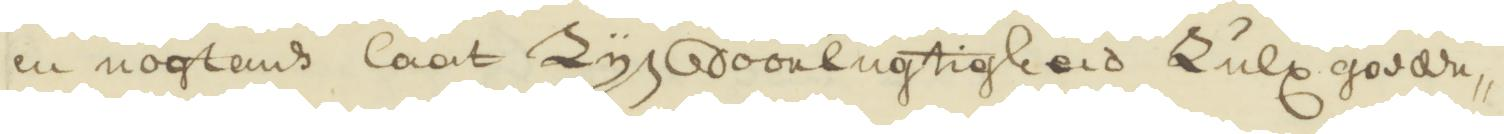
en nogtens laat zijn doorlugtigheid zulx goeder,
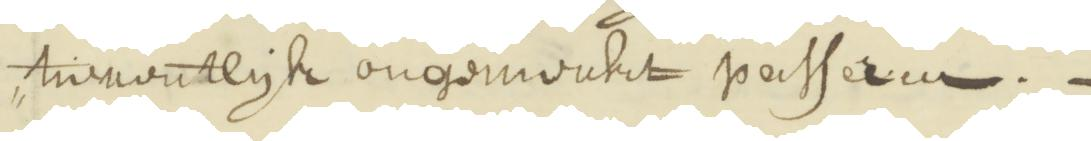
„tierentlijk ongemerkt passeren.
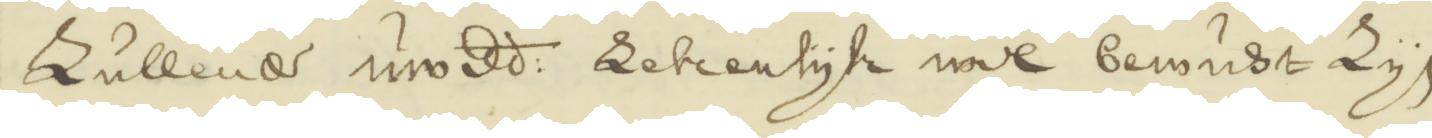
Zullende uwEd: zekerlijk wel bewust zijn
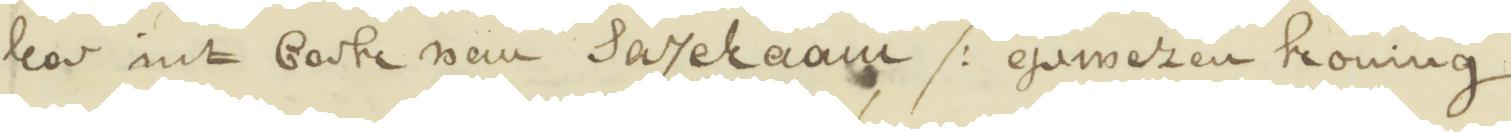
hoe in’t boek van Sajehaam /: gewezen koning
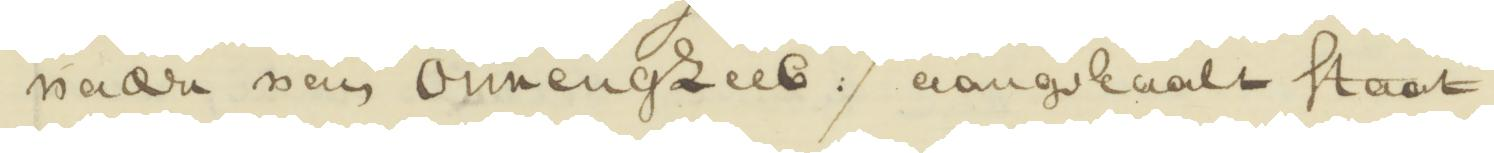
vader van Ourengzeeb :/ aangehaalt staat
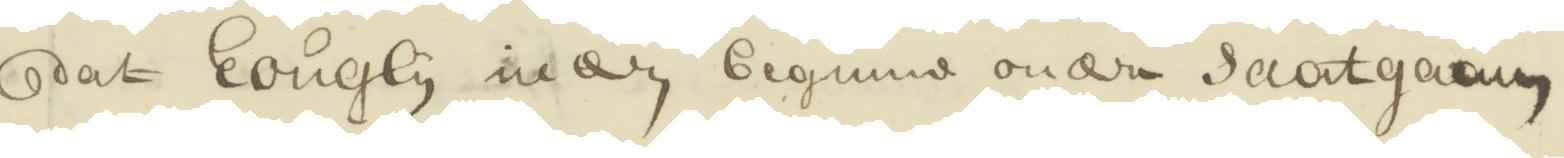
dat houglij in den beginne onder saatgaam
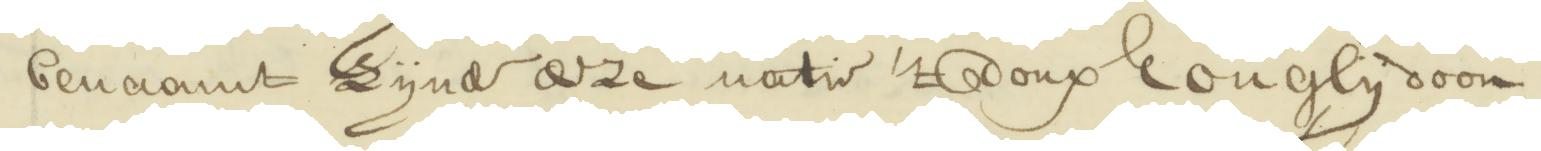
benaamt zijnde deze natie 't dorp houglij door
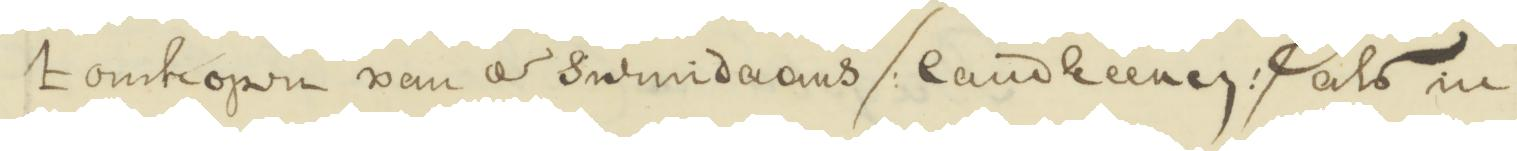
’t omkopen van de siemidaars /:landheeren:/ als in
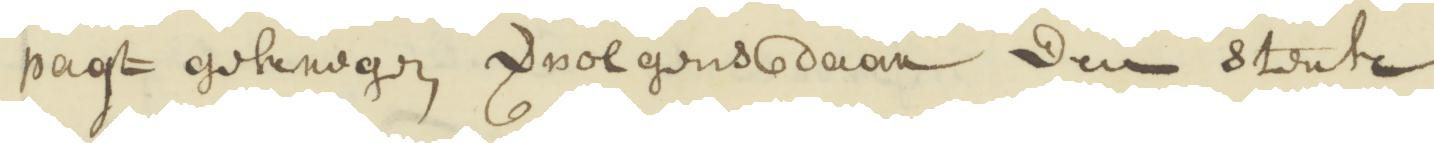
pagt gekregen vervolgens daar Een sterk
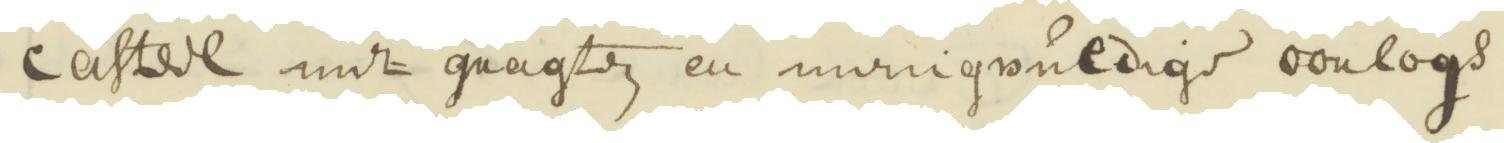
casteel met gragten en menigvuldige oorlogs
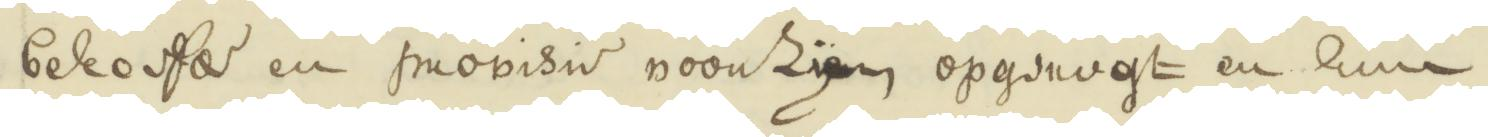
behoefde en provisie voor zijn opgeregt en hun
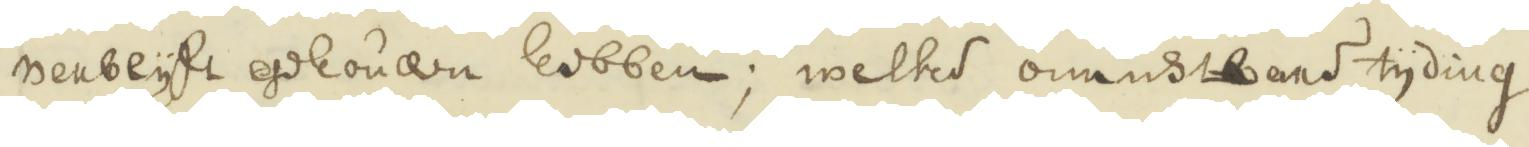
verblijft gehouden hebben; welke onnustbare tijding
